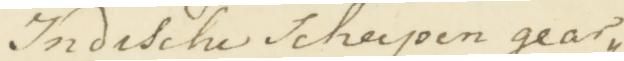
Indische scheepen gear„
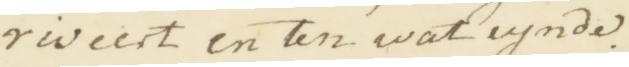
riveert en ten wat eynde.
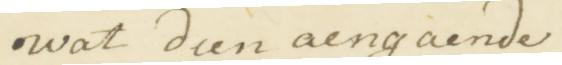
wat dien aengaende
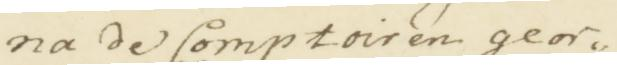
na de Comptoiren geor„
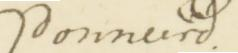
donneerd.
